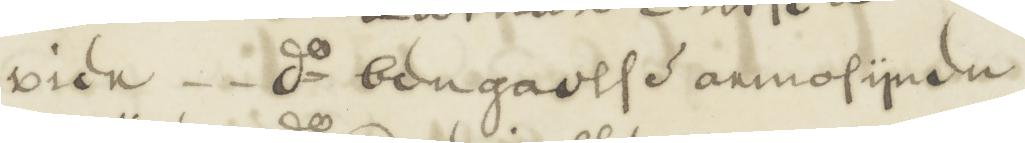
vier - - d=o bengaelss armosijnen
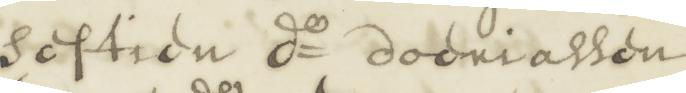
sestien d=o doeriassen
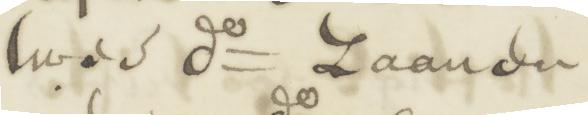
twee d=o Zaanen
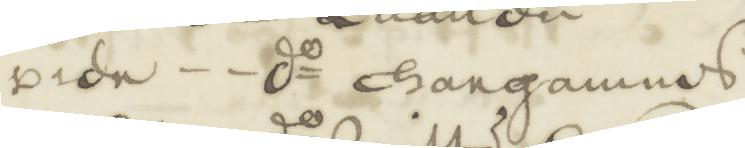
vier - - d=o chargamnes
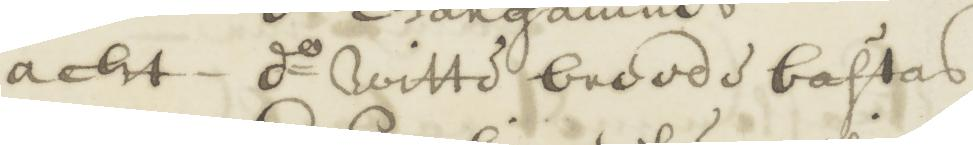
acht - d=o Witte breede baftas
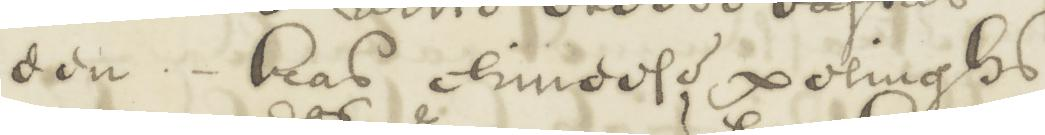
een - kas chineese pelinghs
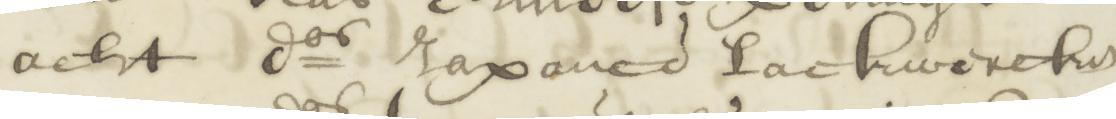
acht d=os Japance Lackwercken
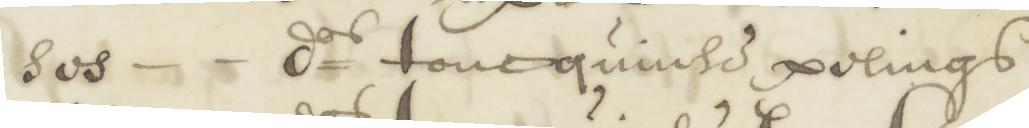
ses - - d=os toncquinse pelings
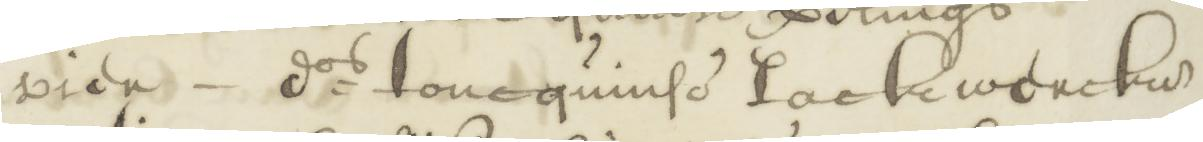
vier - d=os toncquinse lackwercken
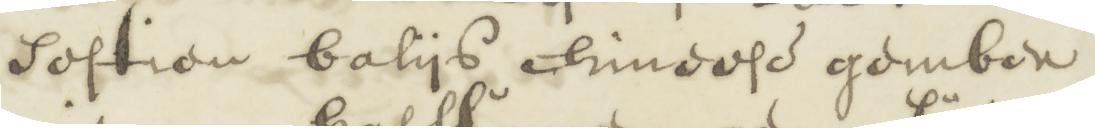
sestien balijs chineese gember
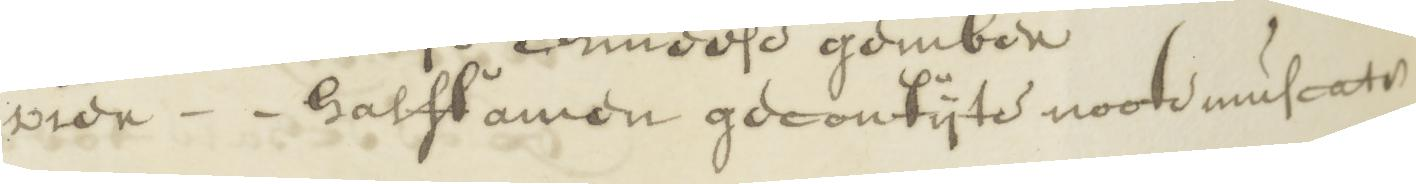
vier - - halfs amen gecontijte noote muscats
